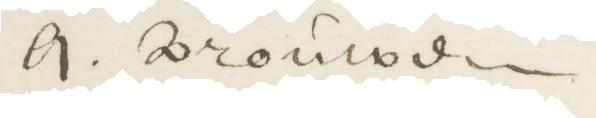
4. vrouwen
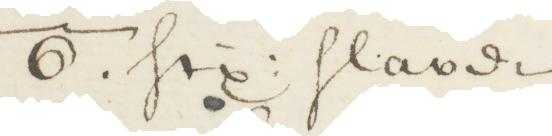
6. stx: slaven
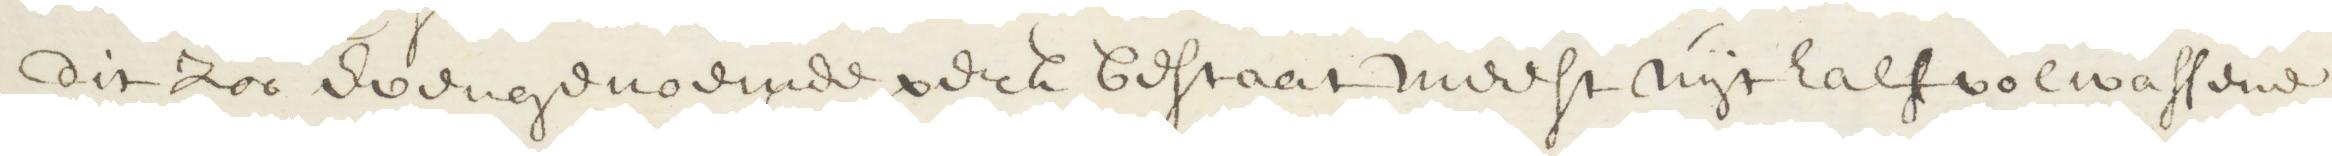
dit zoo Evengenoemde perk bestaat meest uijt half volwassene
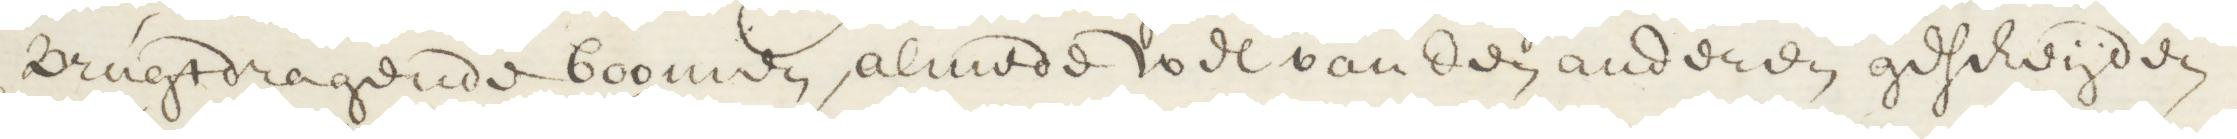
vrugtdragende boomen, almede wel van den anderen gescheijden
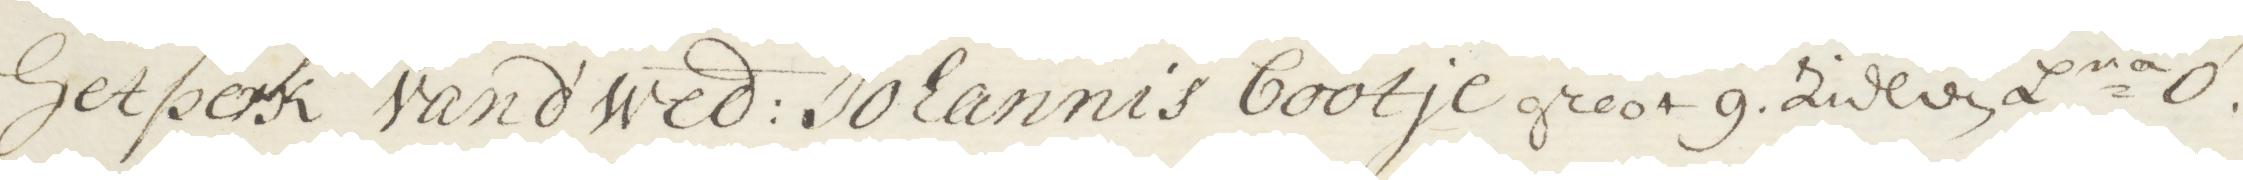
Het perk van d' wed: Iohannis bootje groot 9. zielen L=ra O
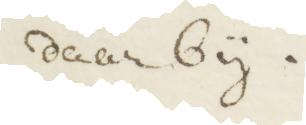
daar bij
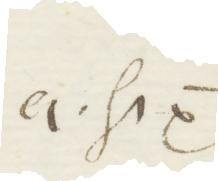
4. stx
